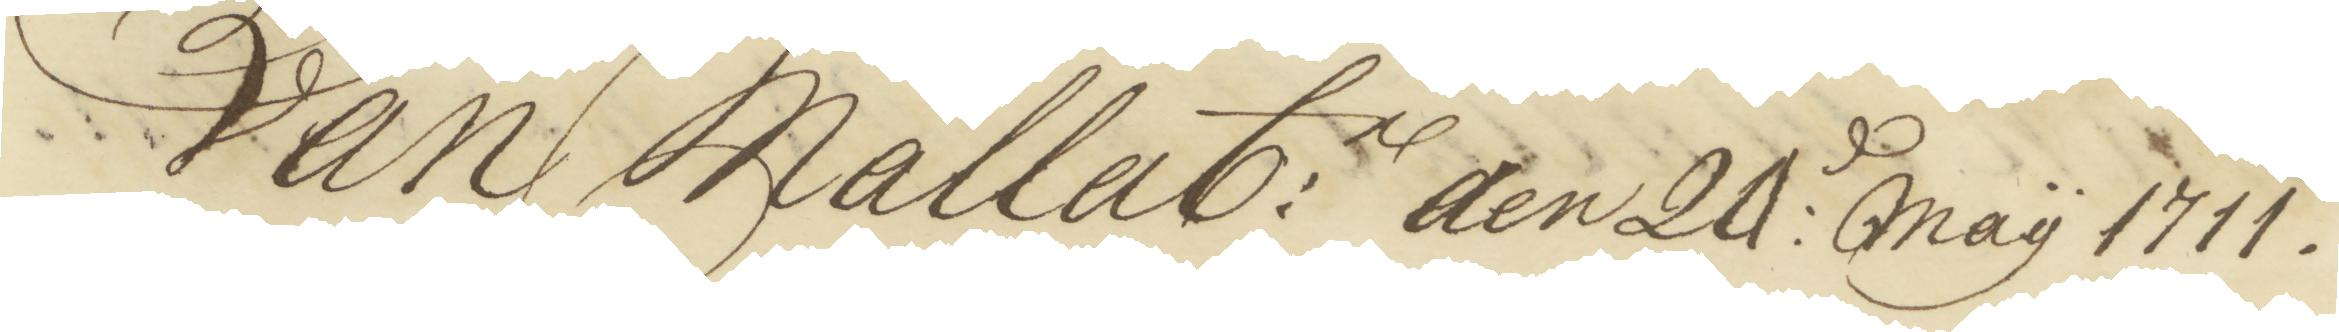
Van Mallab:r den 24:e maij 1711.
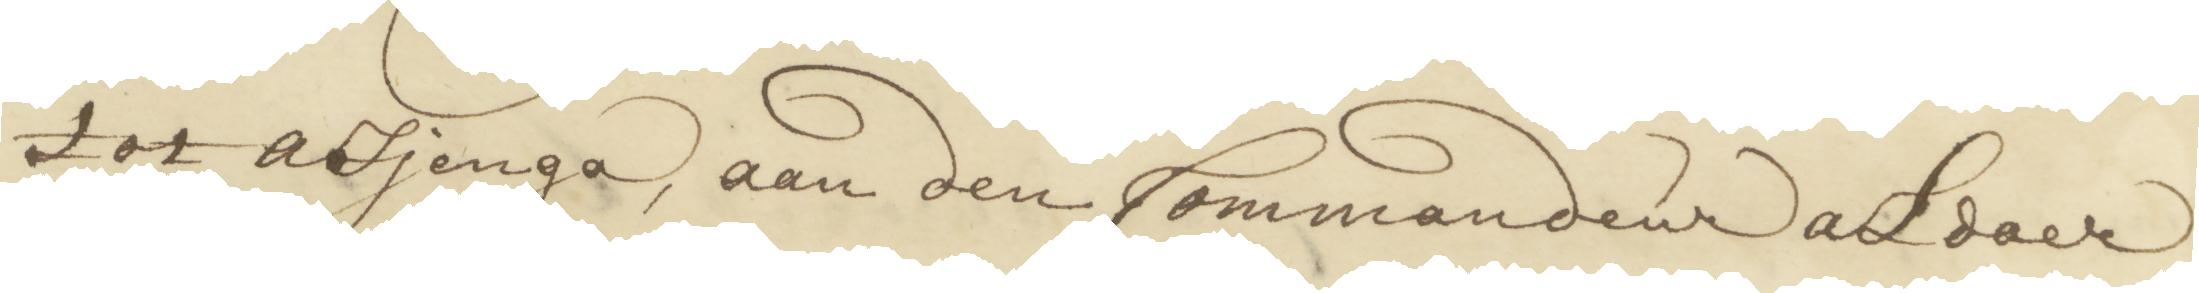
tot asjenga, aan den Commandeur aldaer
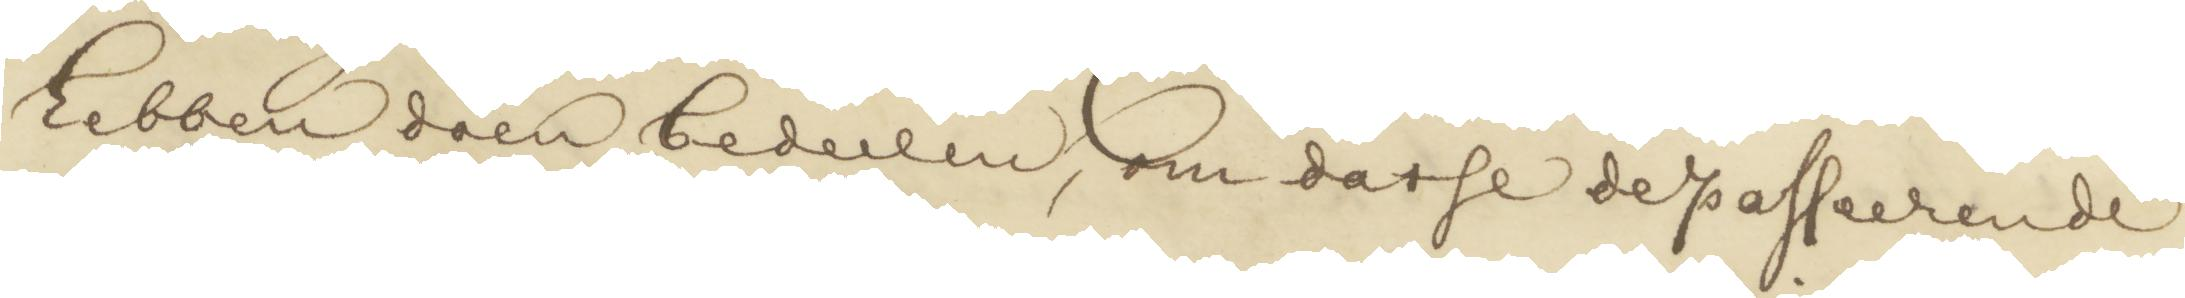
hebben doen bedeelen, om datse de passeerende
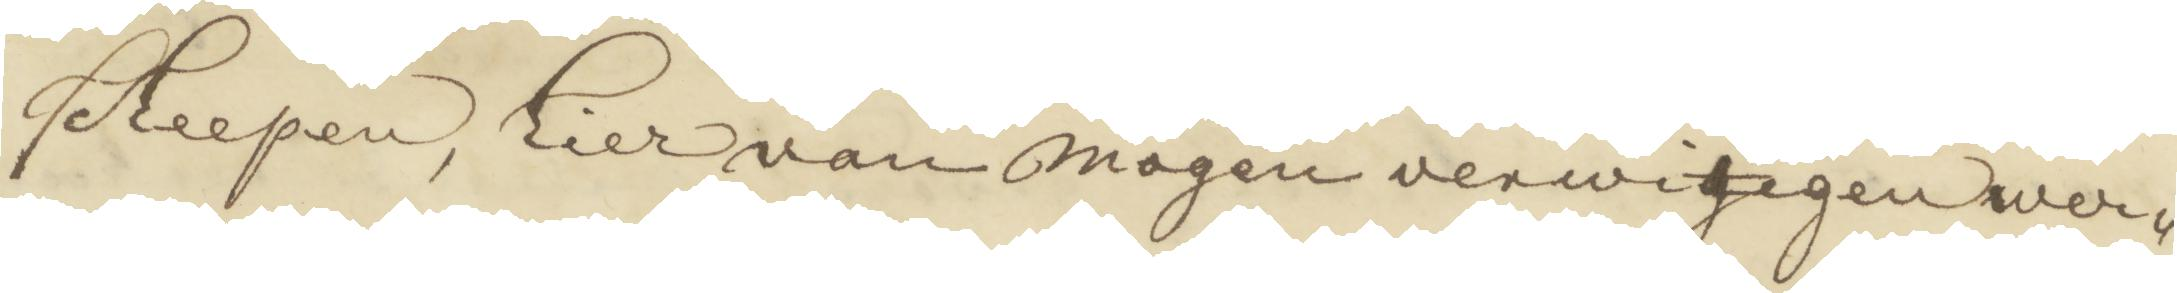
scheepen, hier van mogen verwitigen wer
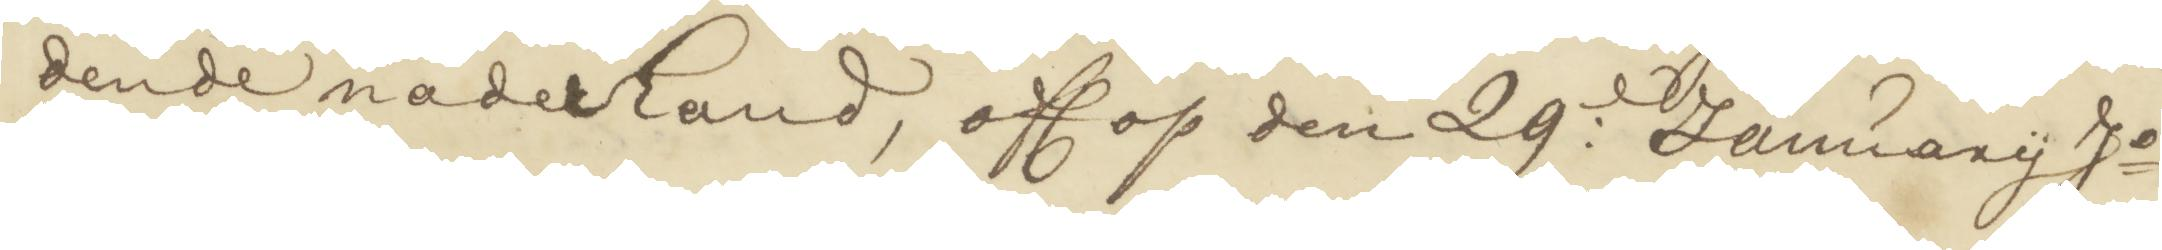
dende naderhand, off op den 29:e Ianuarij J=o
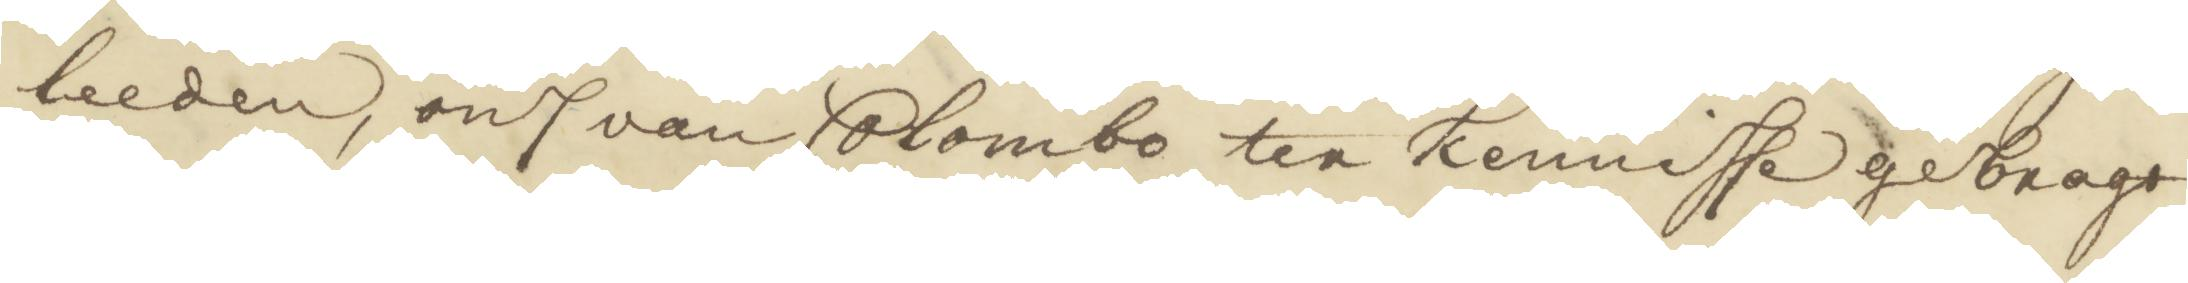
leeden, ons van Colombo ter kennisse gebragt
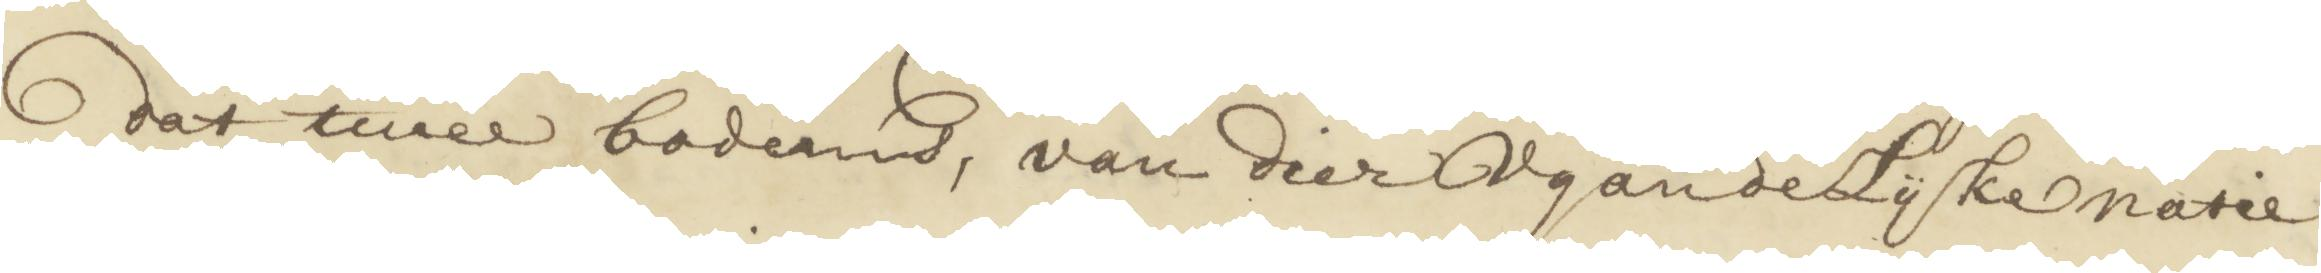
dat twee bodems, van dier vyandelijke natie
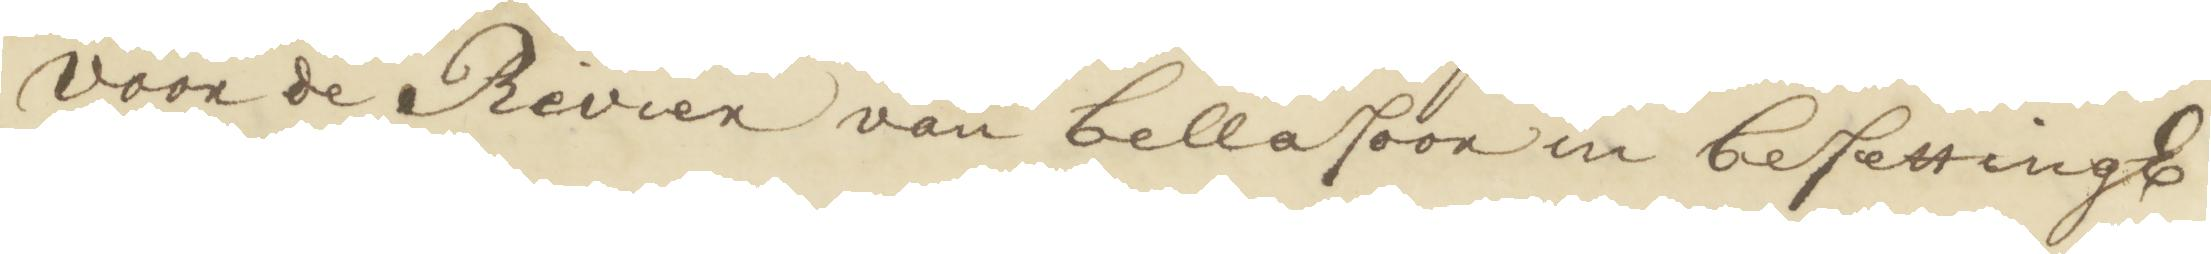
voor de Revier van bellasoor in besettingh
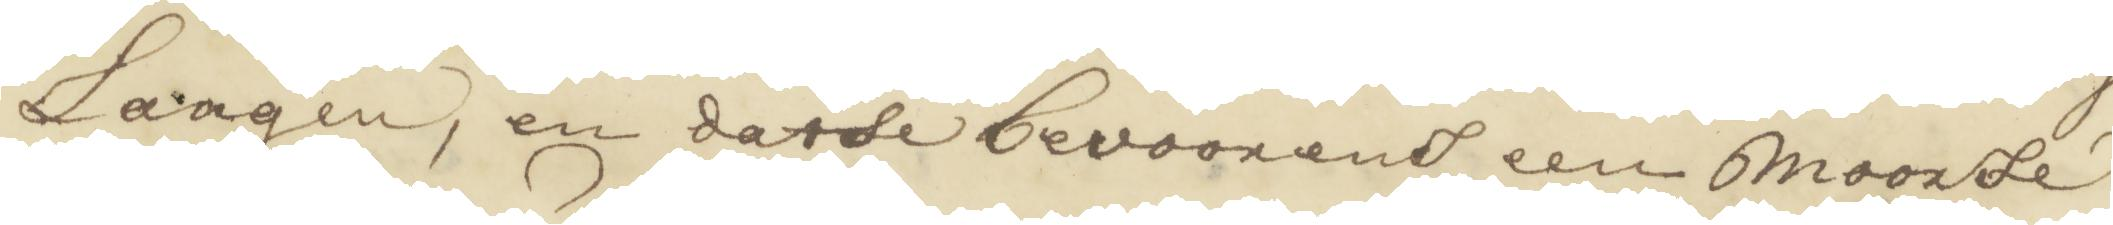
Laagen, en datse bevoorens een moorse
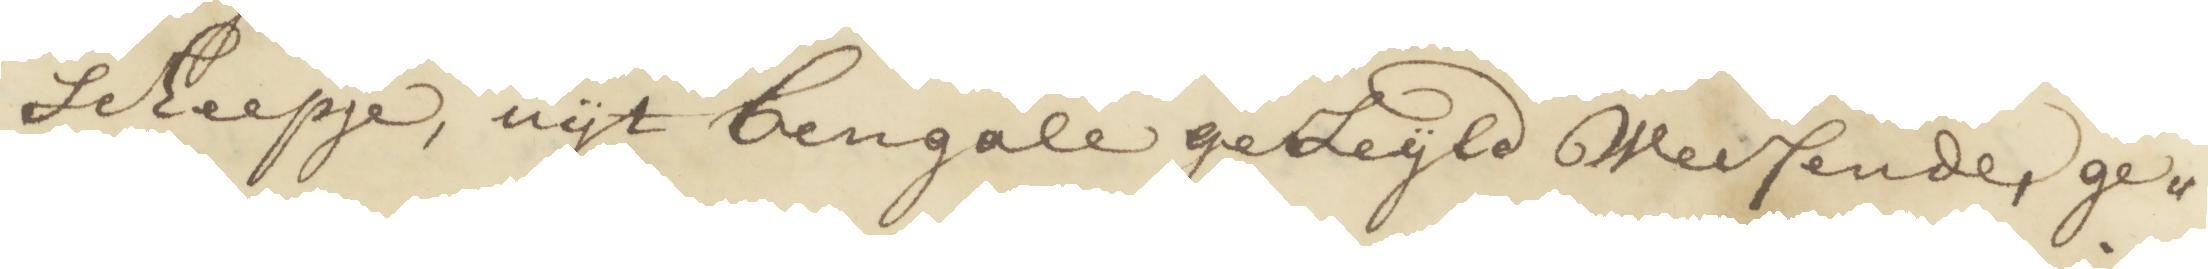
scheepje, uijt bengale geseijld weesende, ge„
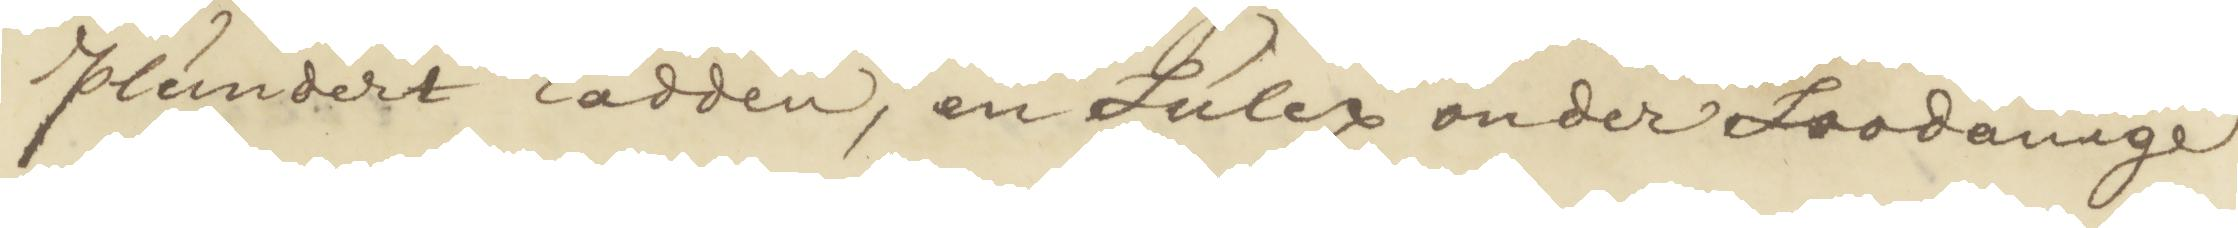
plundert hadden, en sulcx onder soodanige
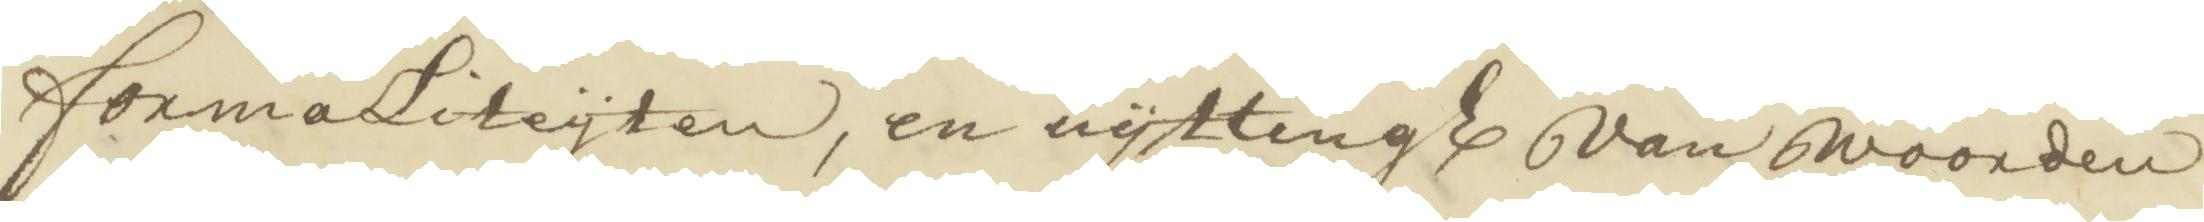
formaliteijten, en uijttingh van woorden
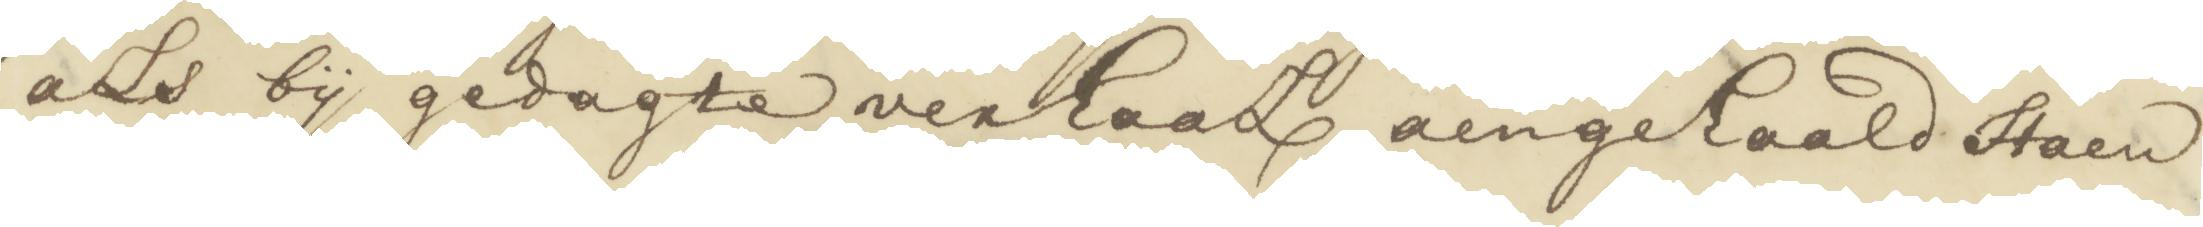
als bij gedagte verhaal aengehaald staen
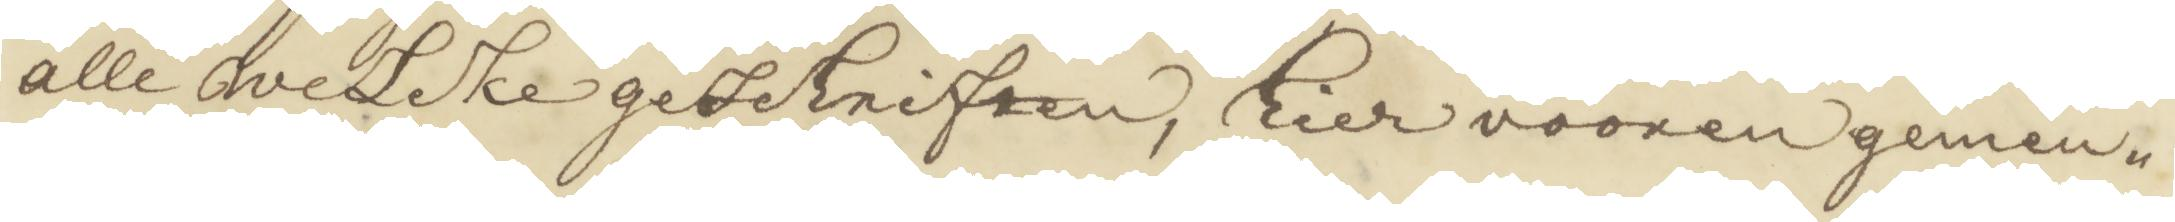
alle welcke geschriften, hier vooren gemen„
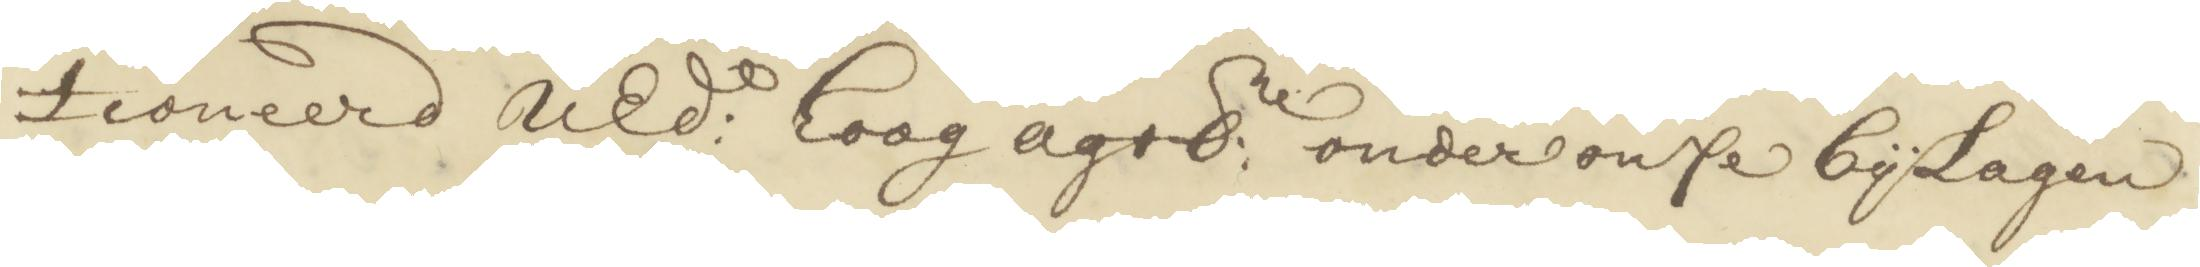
tioneerd UEd:e hoog agtb:re onder onse bijlagen
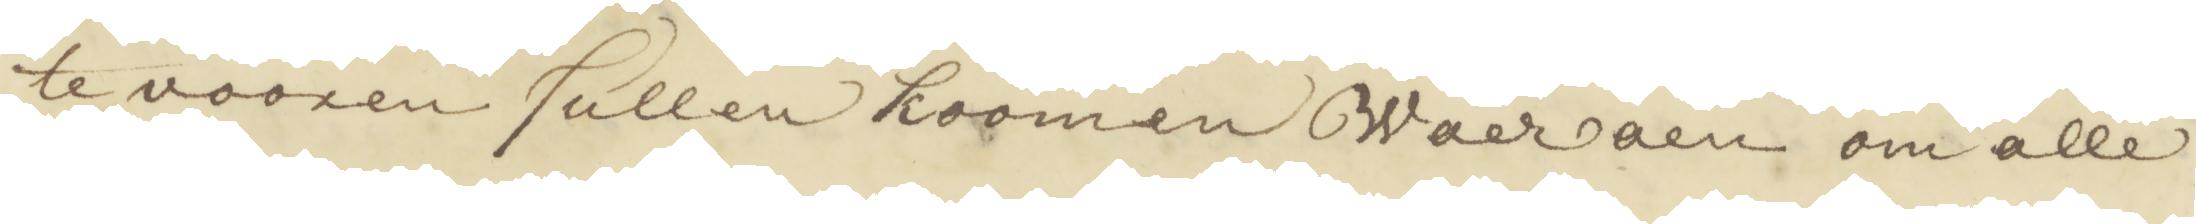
te vooren sullen koomen waeraen om alle
